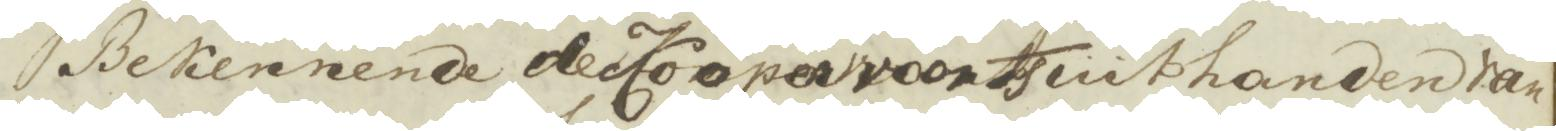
Bekennende de Kooper voorts uit handen van
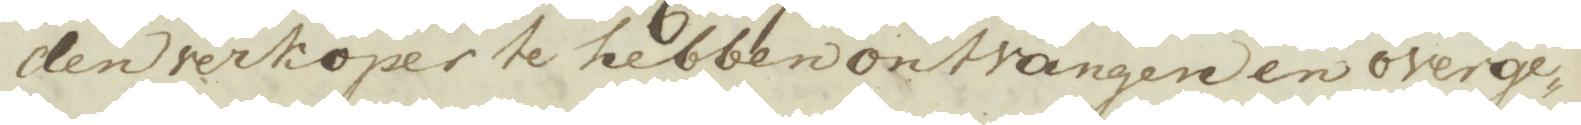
den verkoper te hebben ontvangen en overge„
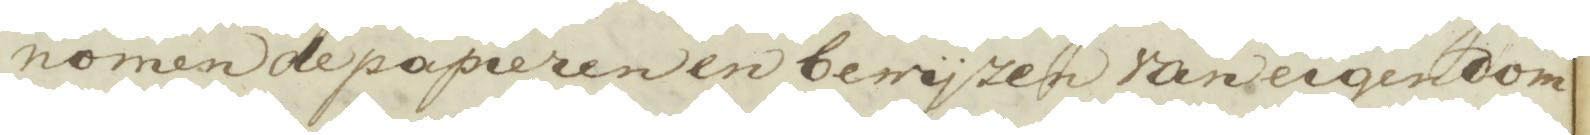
nomen de papieren en bewijzen van eigendom
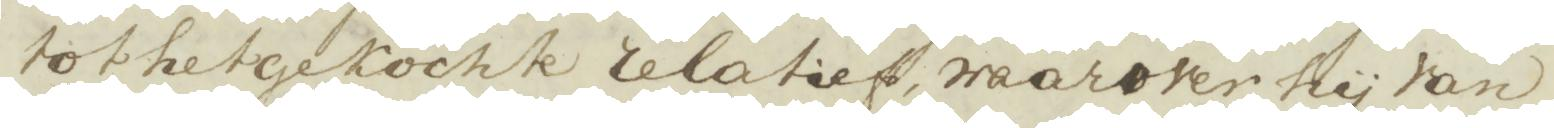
tot het gekochte relatief, waarover hij van
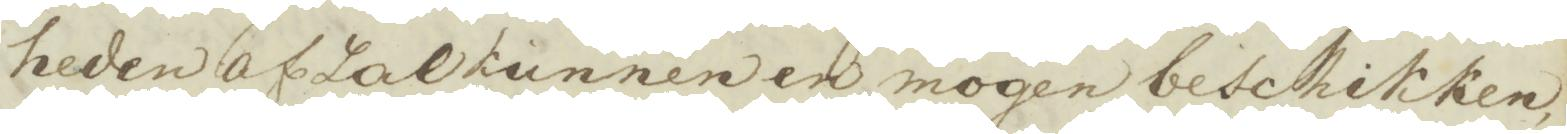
heden af zal kunnen en mogen beschikken,
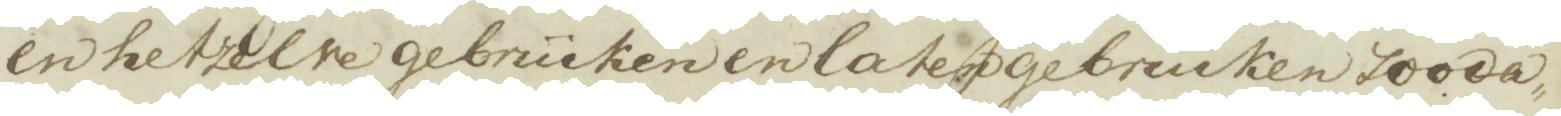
en het zelve gebruiken en laten gebruiken zooda„
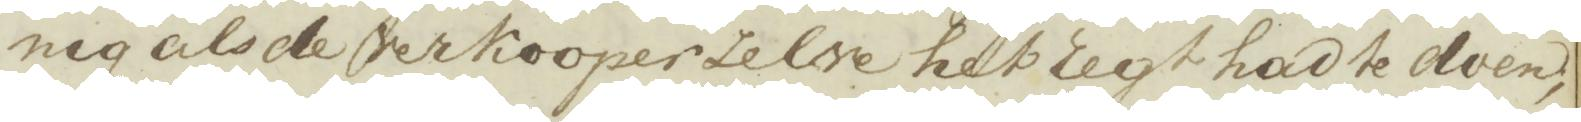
nig als de verkooper zelve het regt had te doen,
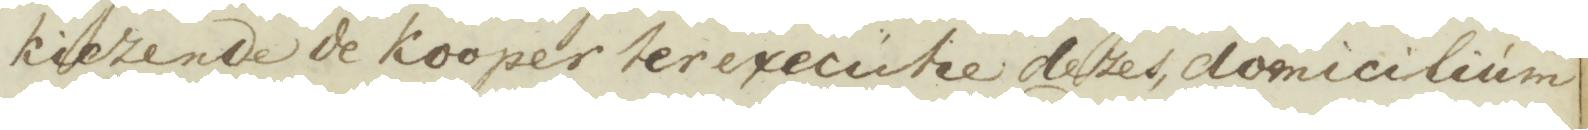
kiezende de kooper ter executie dezes, domicilium
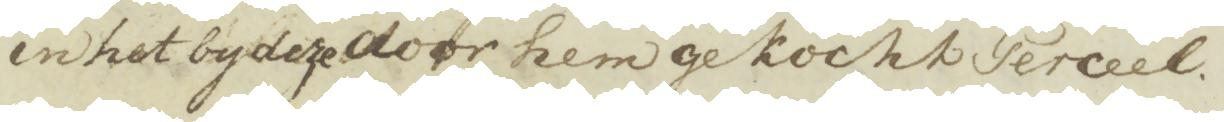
in het by deze door hem gekocht Perceel.
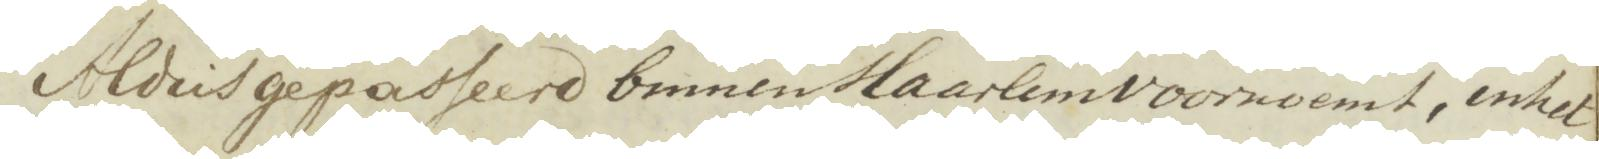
Aldus gepasseerd binnen Haarlem voornoemt, in het
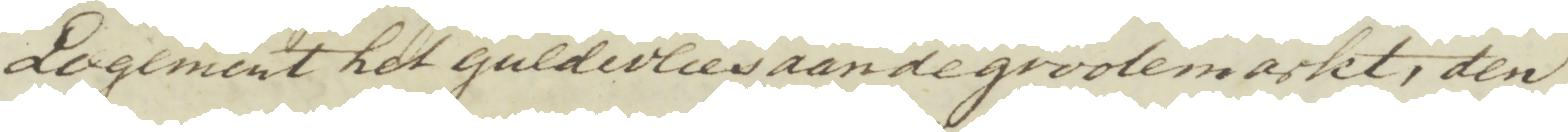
Logement het guldevlies aan de grootemarkt, den
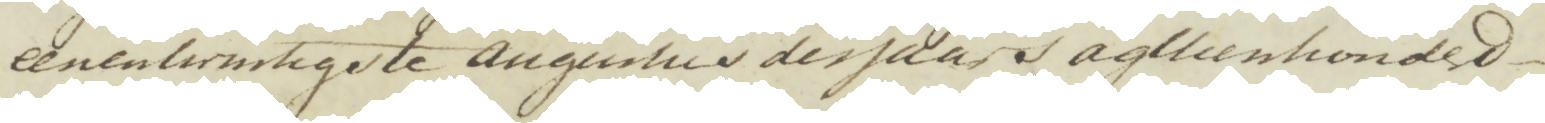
eenentwintigste augustus des jaars agttienhonderd
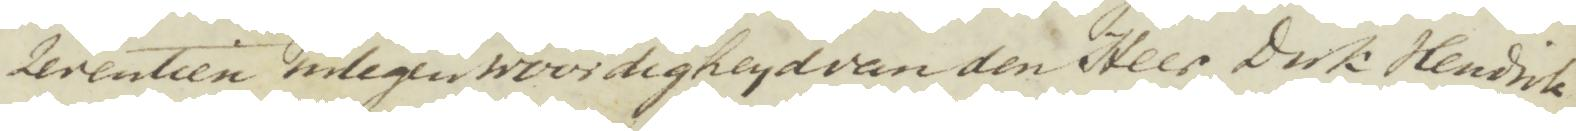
zeventien integenwoordigheyd van den Heer Dirk Hendrik
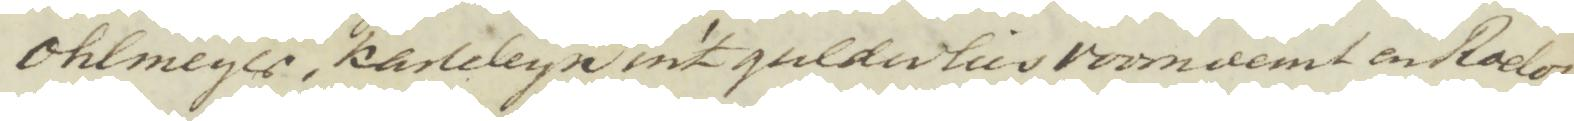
Ohlmeyer, kasteleyn in’t guldevlies voornoemt en Roelof
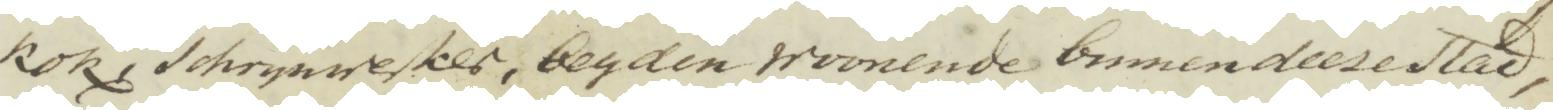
Kok, schrynwerker, beyden woonende binnen deeze Stad,
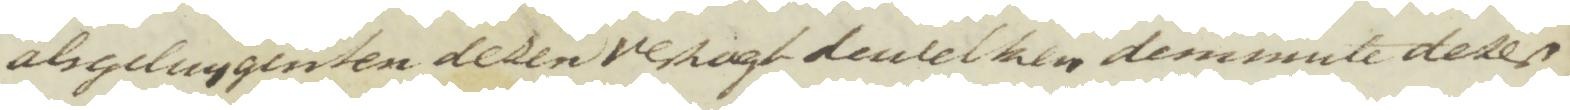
als geluygen ten dezen verzogt dewelken de minute dezes
